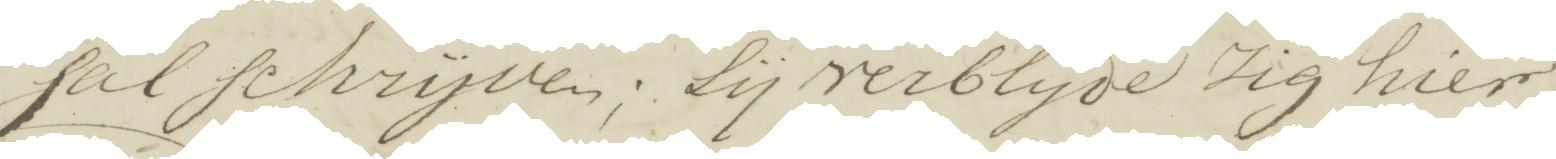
sal schrijven; sij verblijde zig hier
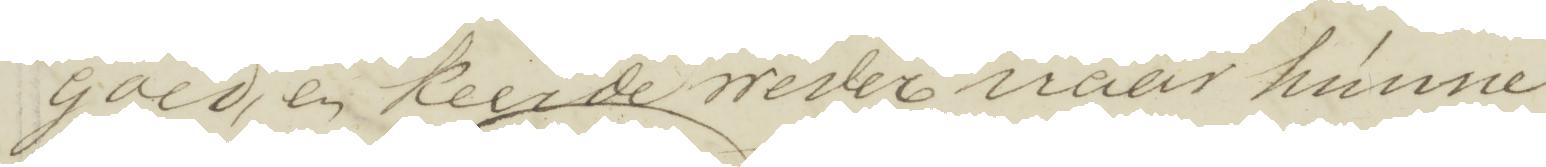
goed, en keerde weder naar hunne
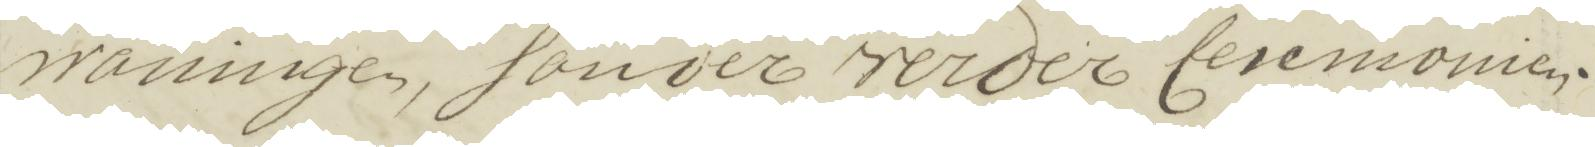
woningen, sonder verder Ceremonien.
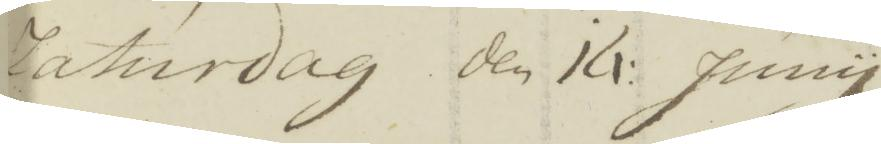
Zaturdag den 14: Junij
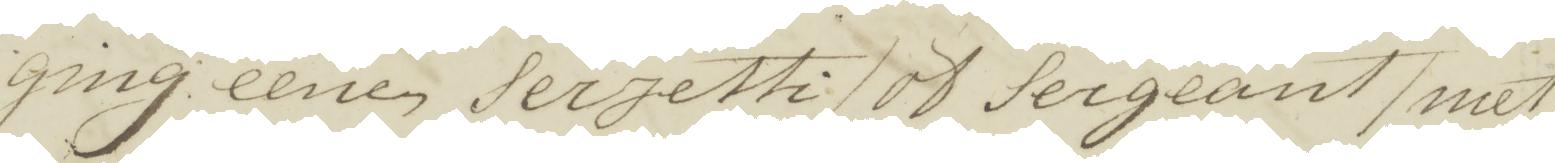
ging eene serjetti /of sergeant/ met
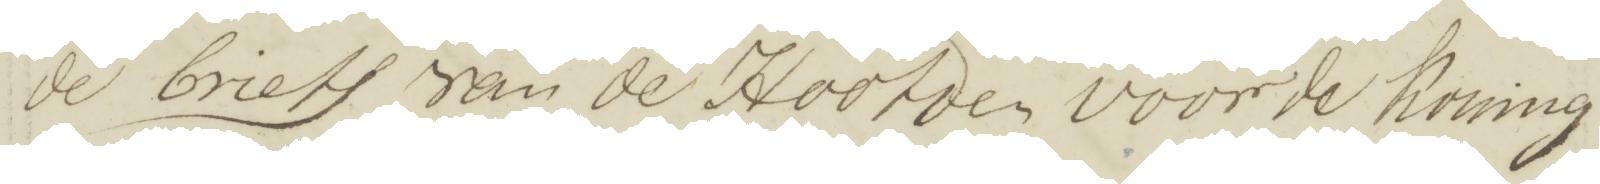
de brieff van de Hoofden voor de Koning
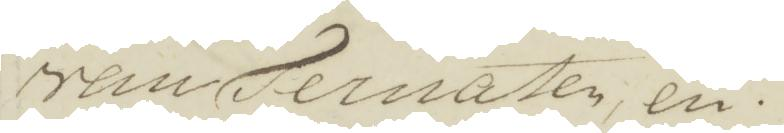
van Ternaten, en.
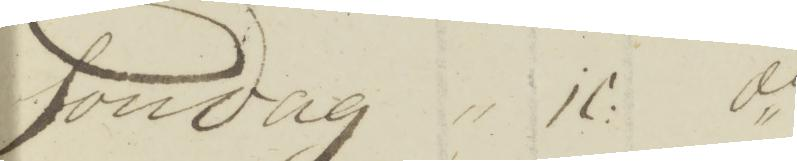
Sondag „ 15: d„o
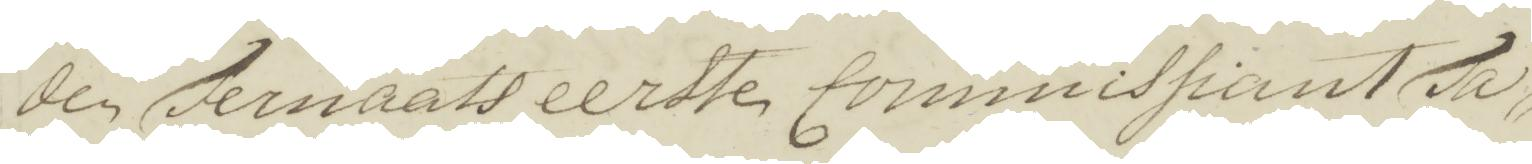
den Ternaats eerste Commissiant Ta„
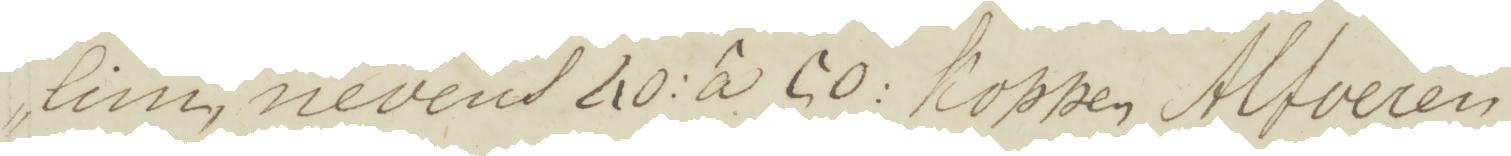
„lim, nevens 40: â 50: koppen Alfoeren
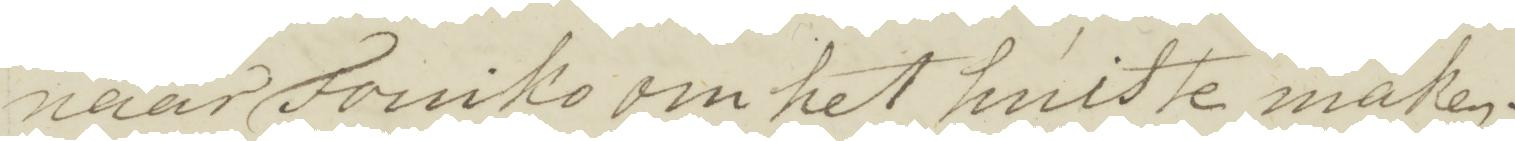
naar Toniko om het huis te maken.
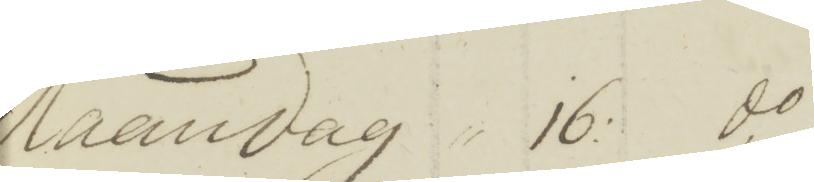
Maandag „ 16: d„o
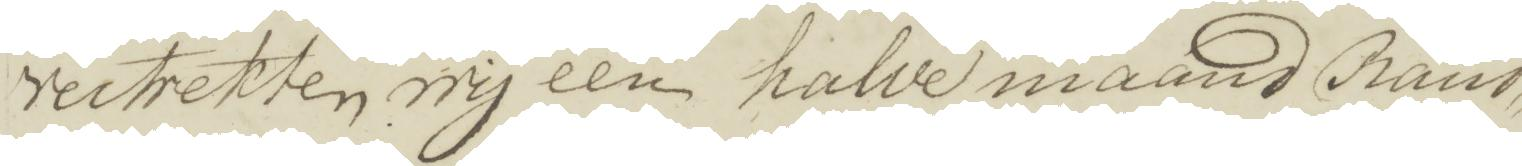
vertrekten wij een halve maand Rand„
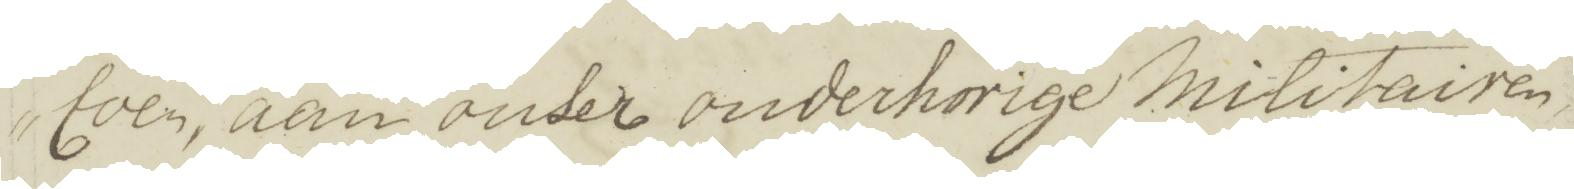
„soen, aan onser onderhorige militairen,
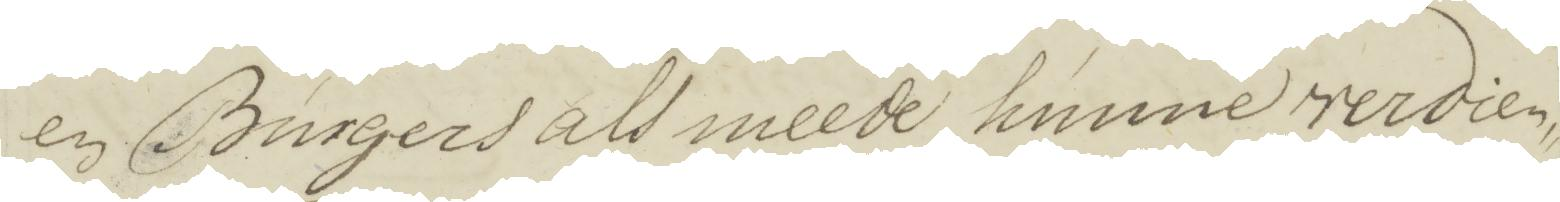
en Burgers als meede hunne verdien„
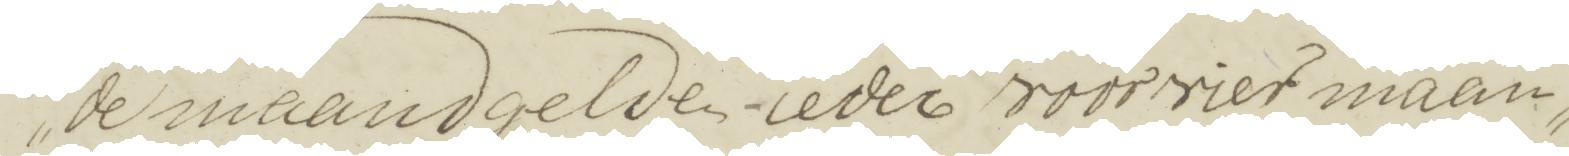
„de maandgelden ieder voor vier maan„
